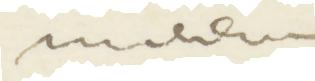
meen
